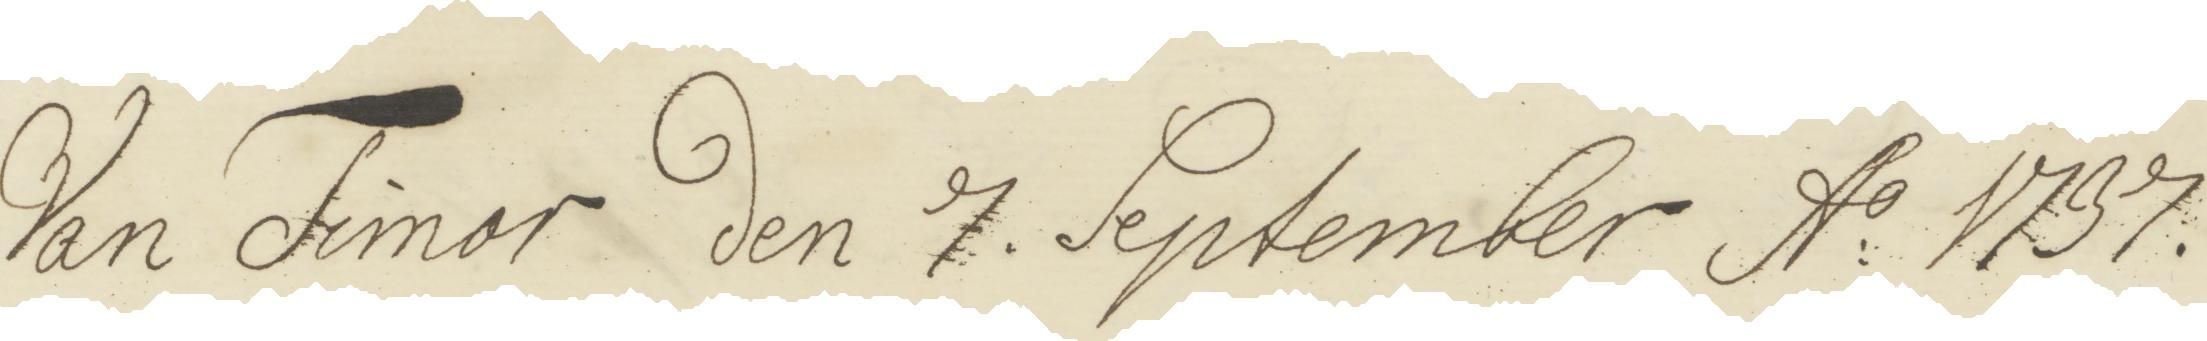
Van Timor den 7. September A:o 1737.
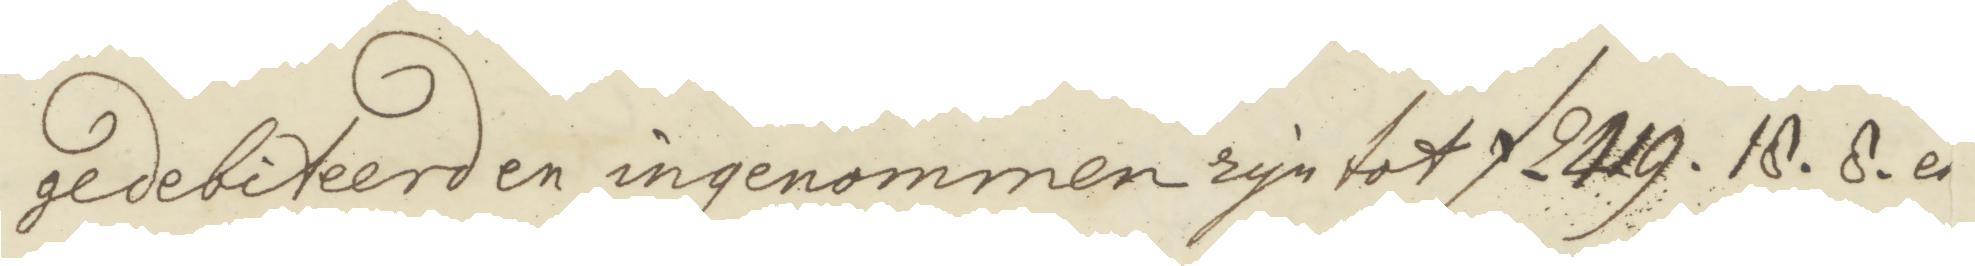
gedebiteerden ingenommen zijn tot ƒ2419. 18. 8. e
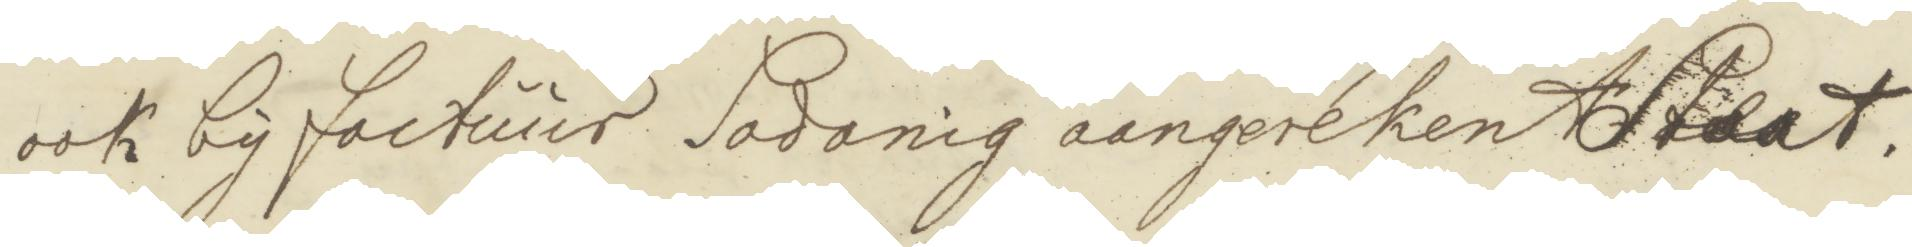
ook bij factuur sodanig aangerekent staat.
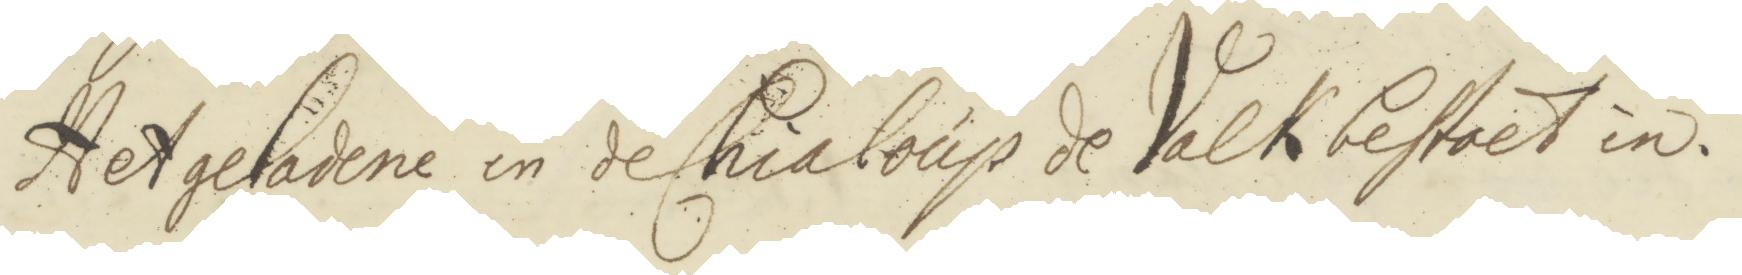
Het geladene in de Chialoup de Valk bestaet in.
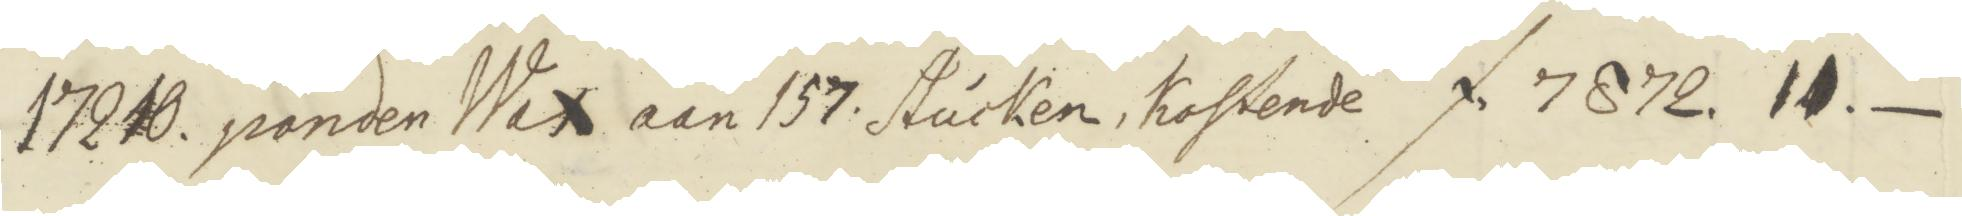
17218. ponden Wax aan 157. stucken, kostende ƒ 7872. 11. —
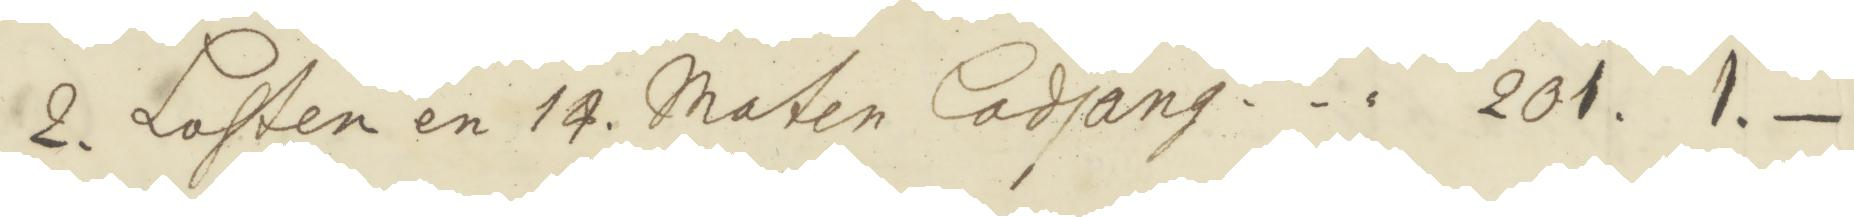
2. Lasten en 14. Maten Cadjang - - „ 201. 1. —
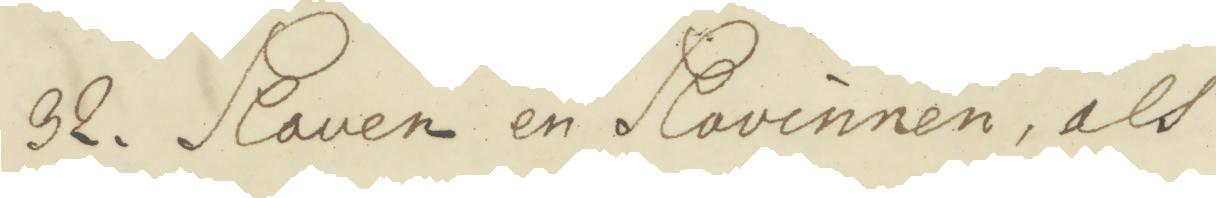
32. Slaven en Slavinnen, als
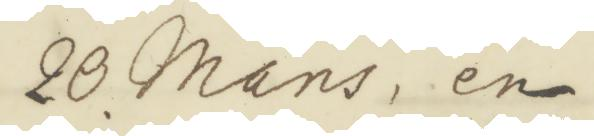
28. Mans, en
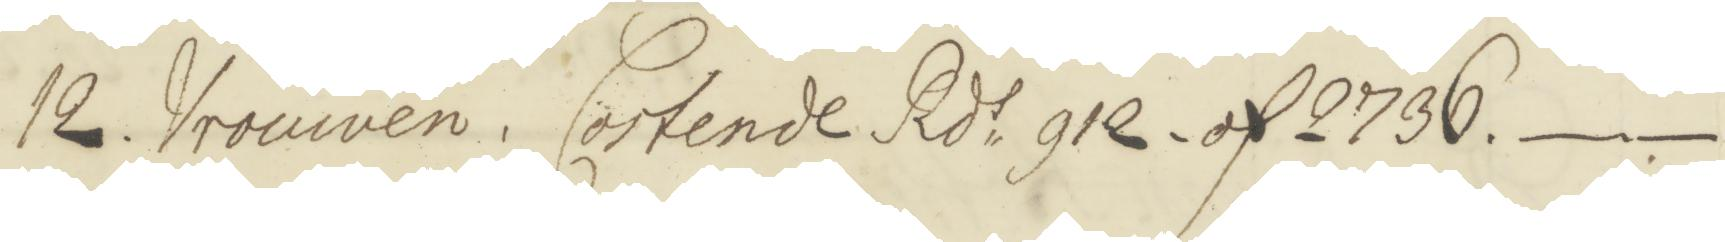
12. Vrouwen, Costende Rd„s 912 - of 2736. —. —
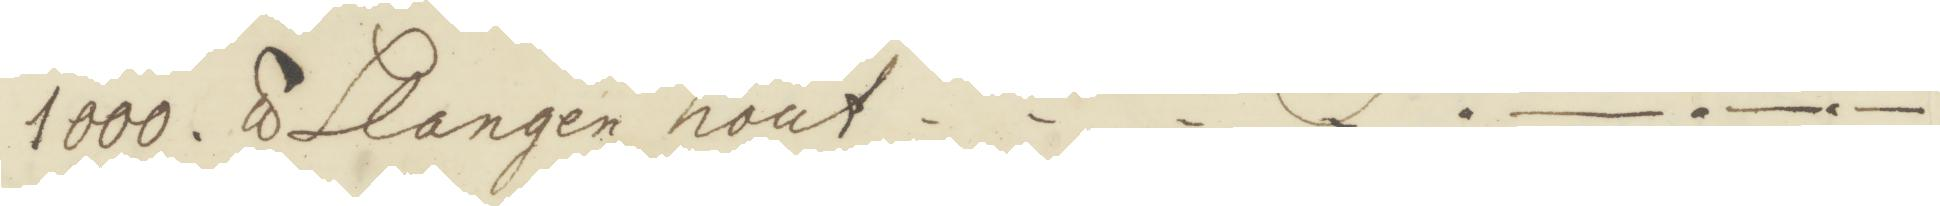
1000. lb Slangen hout - - - - —. — —
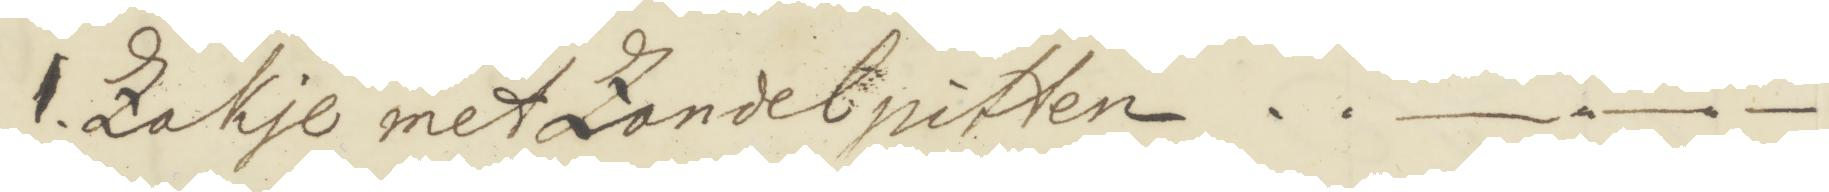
1. zakje met Zondel pitten - . —.—. —
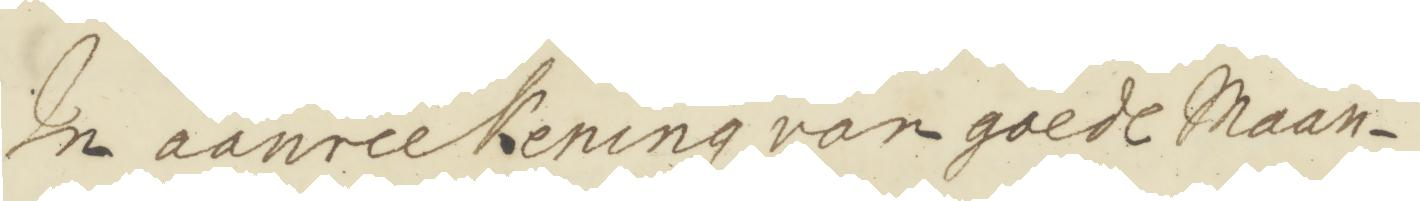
In aanreekening van goede Maan
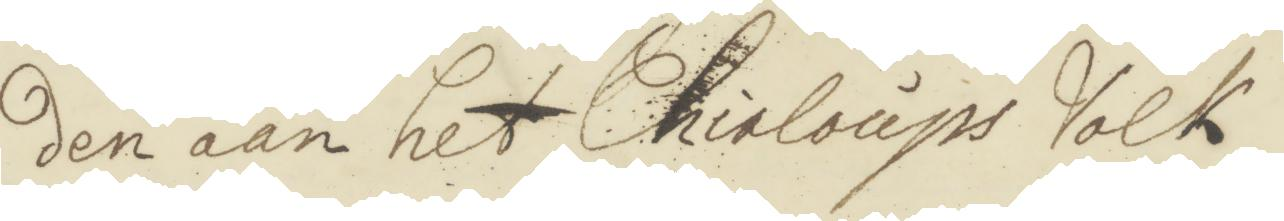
den aan het Chialoups Volk
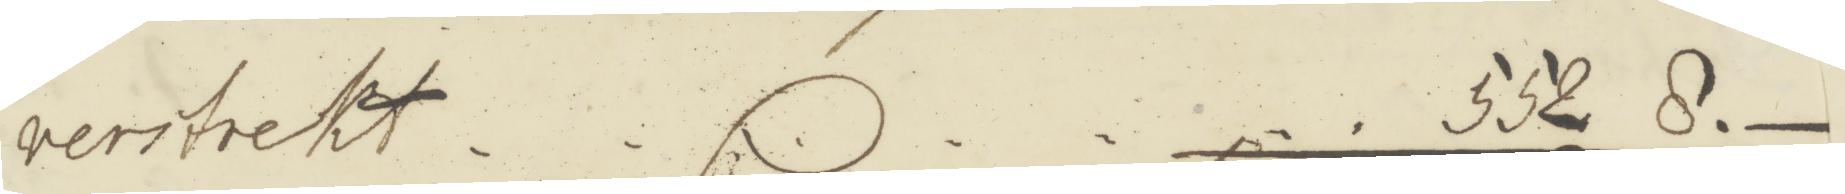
verstrekt - - - - - - „ 552 8. —
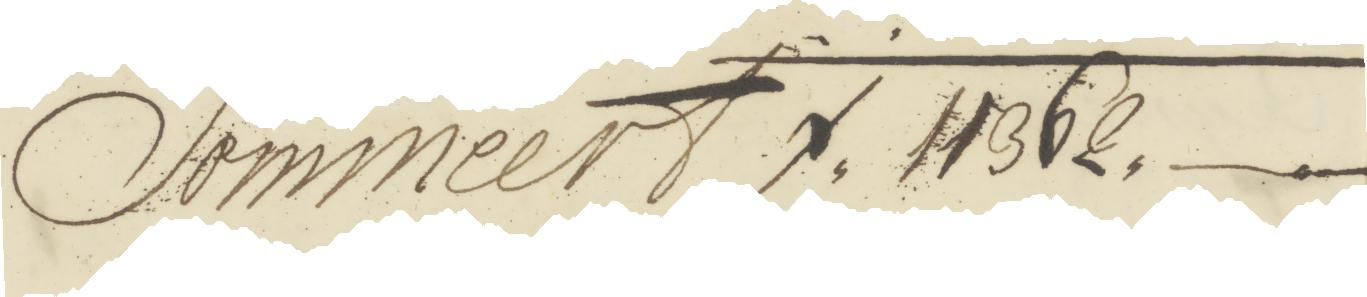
Sommeert ƒ„ 11362„ —.—
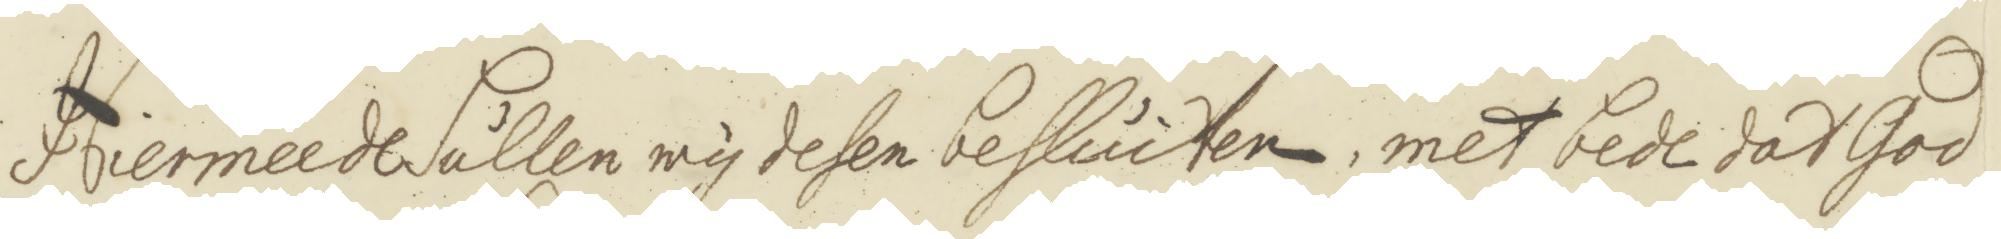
Hiermeede sullen wij desen besluiten, met bede dat God
